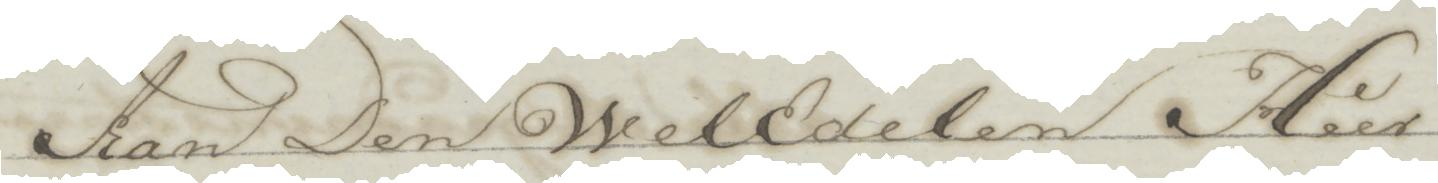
Aan Den Wel Edelen Heer
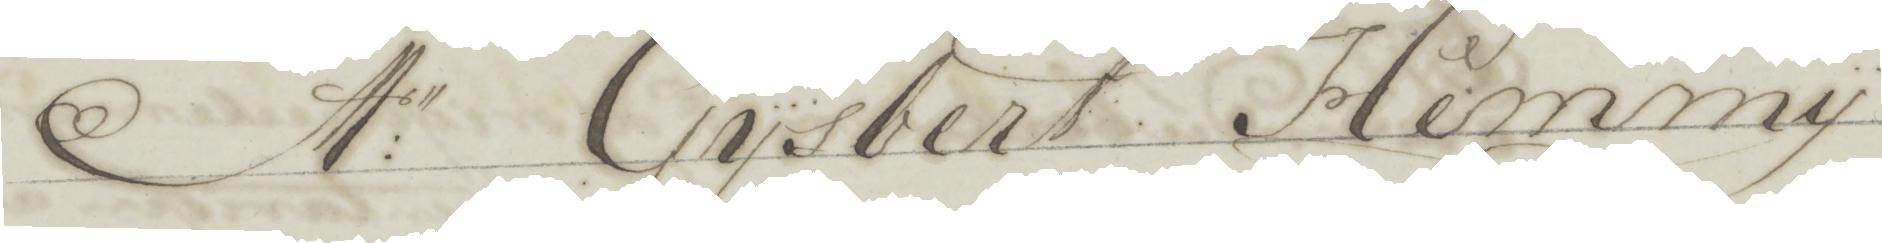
M:„ Gijsbert Hemmij
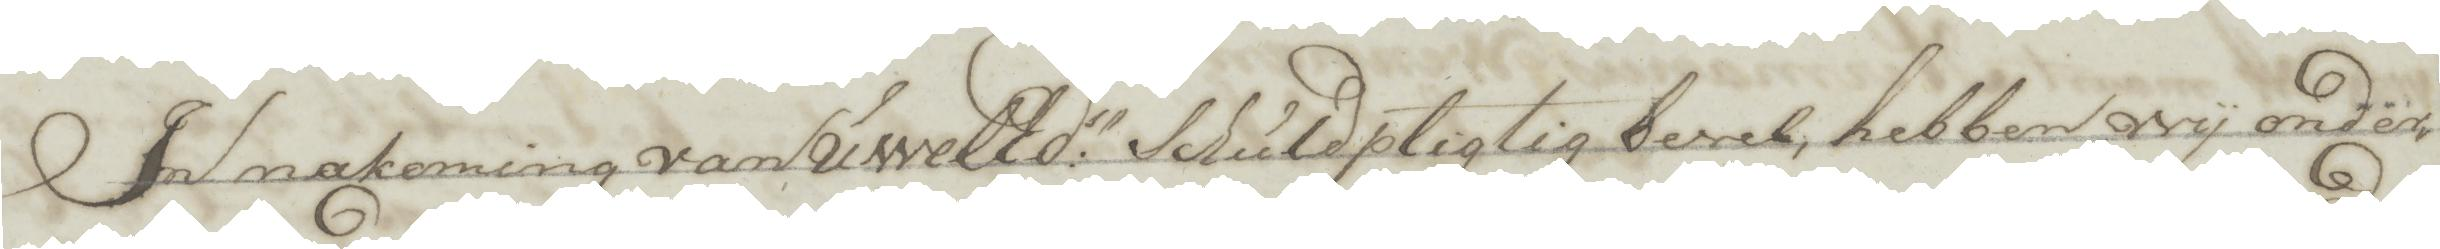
Jn nakoming van u welEd:s schuldpligtig bevel, hebben wij onder„
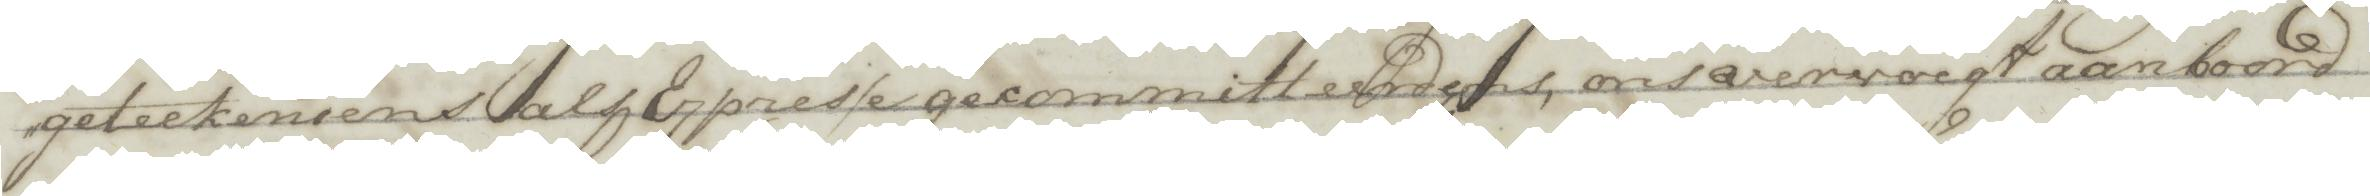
„geteekendens als Expresse gecommitteerdens, ons vervoegt aan boord
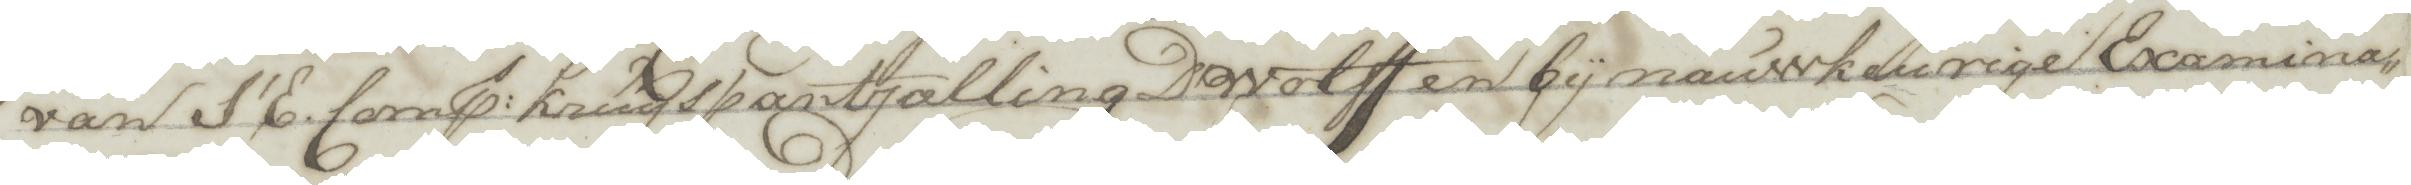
van S'E. Comp: kruijspantjalling D'wolff en bij nauwkeurige Examina„
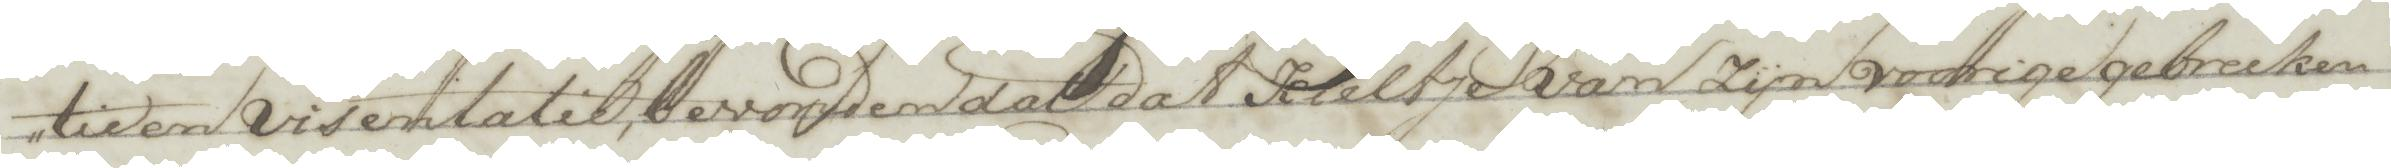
„tie en visentatie, bevonden dat dat kieltje van zijn voorige gebreeken
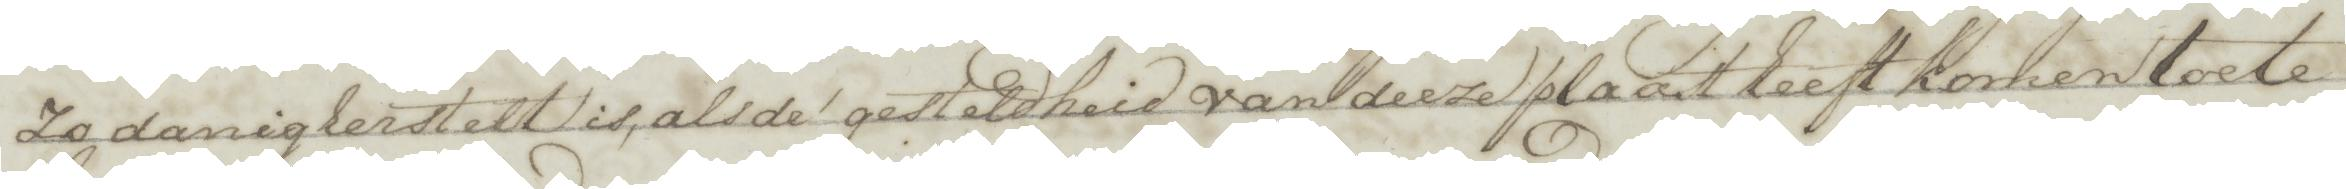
zodanig herstelt is, als de' gesteldheid van deeze plaast heeft komen toete
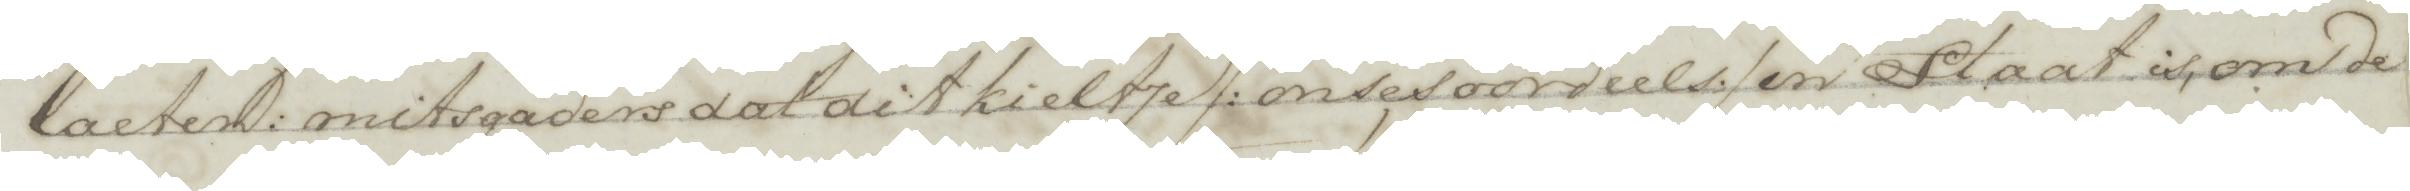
laeten: mitsgaders dat dit kieltje /:onses oordeels:/ in Staat is, om de
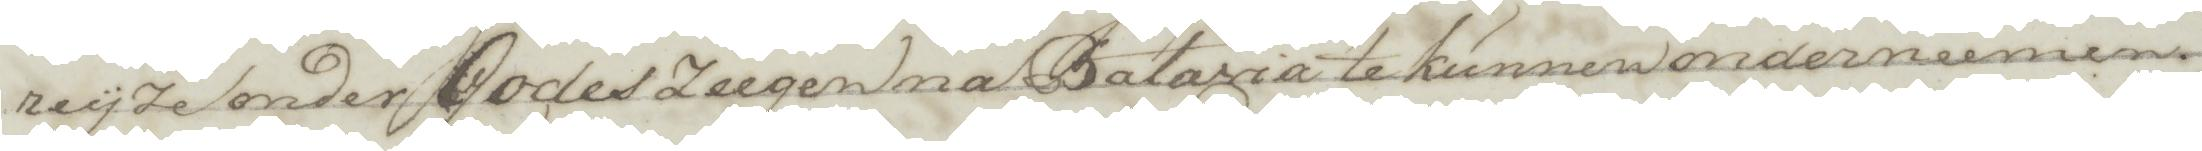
reijze onder Godes zeegen na Batavia te kunnen onderneemen.
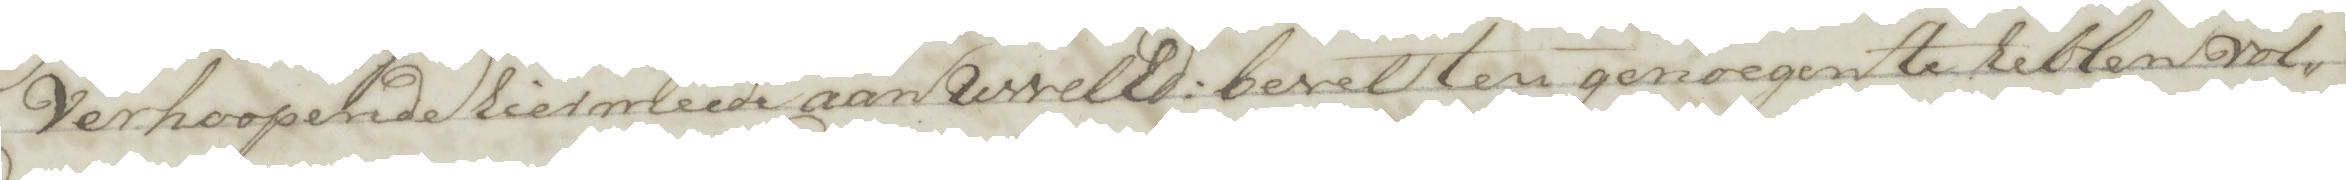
Verhoopende hiermeede aan uwelEd: bevel ten genoegen te hebben vol„
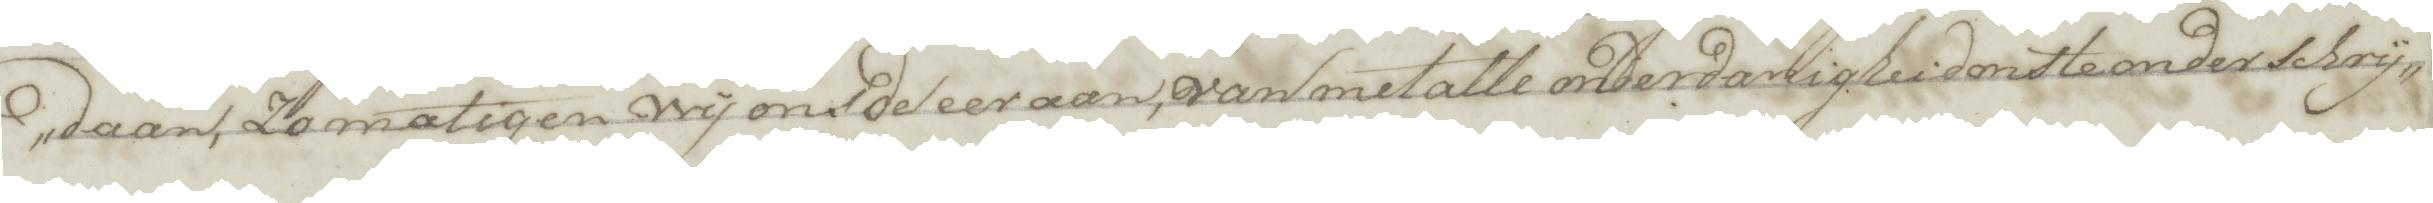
„daan, zo matigen wij ons de eer aan, van met alle onderdanigheid ons te onderschrij„
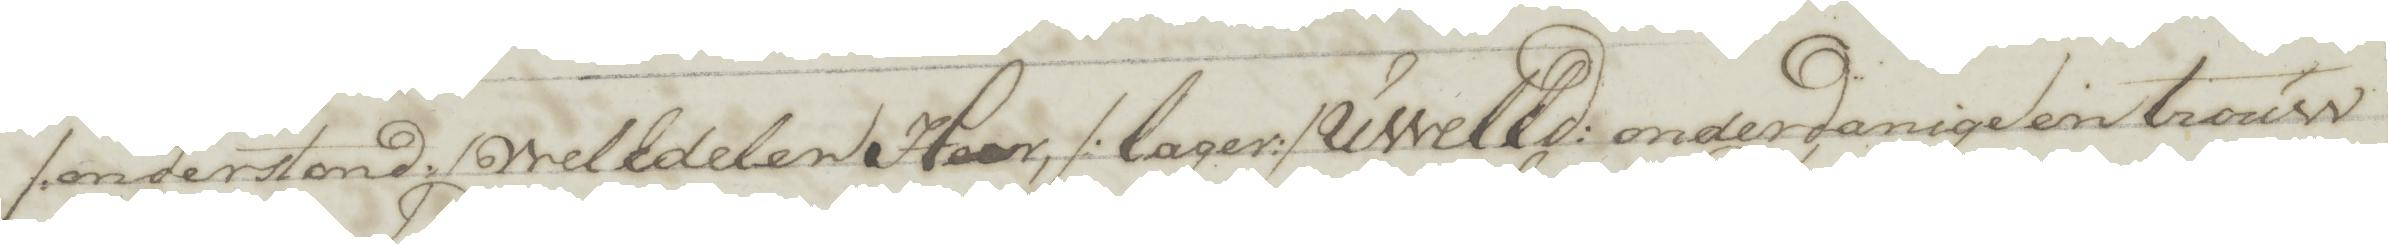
/:onderstond:/ Wel Edelen Heer, /:lager:/ Uwel Ed: onderdanige en trouw
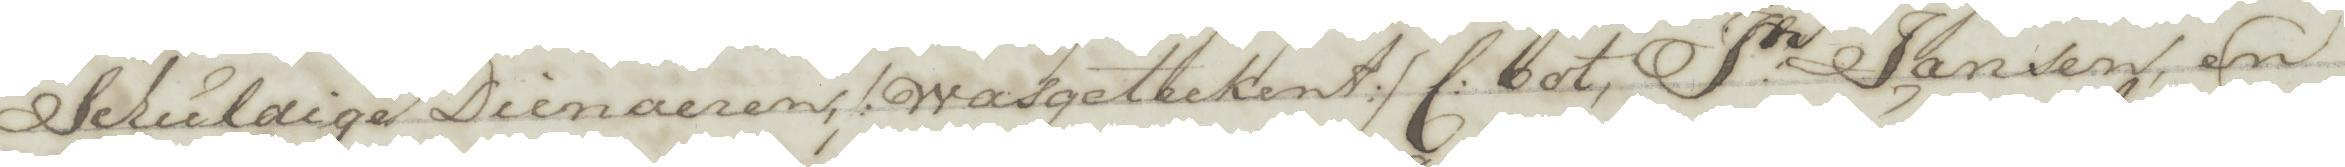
Schuldige Dienaeren, /:was geteekent:/ C: bot, J:n Jansen, en
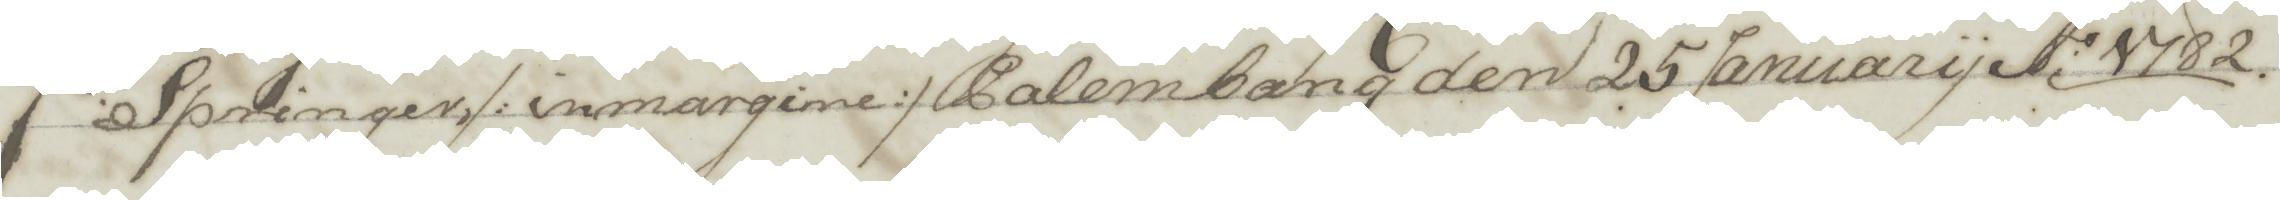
Jb." Springer,/: in margine:/ Palembang den 25 Januarij A:o 1782.
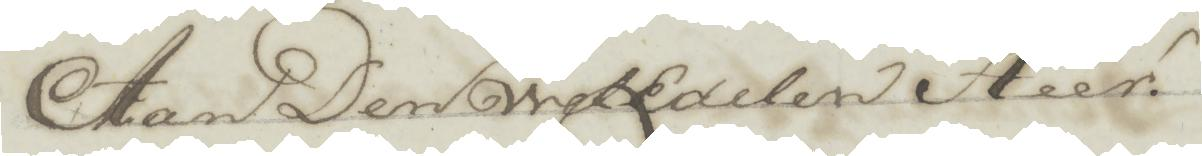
Aan Den Wel Edelen Heer.
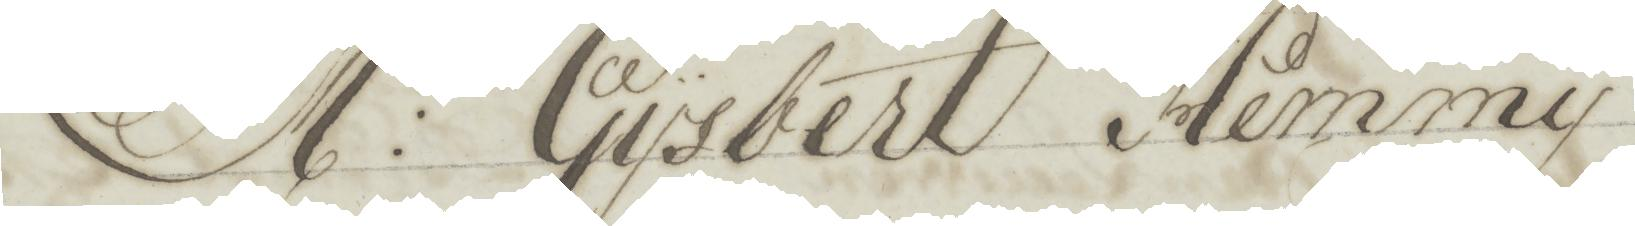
M:r" Gijsbert Hemmij
